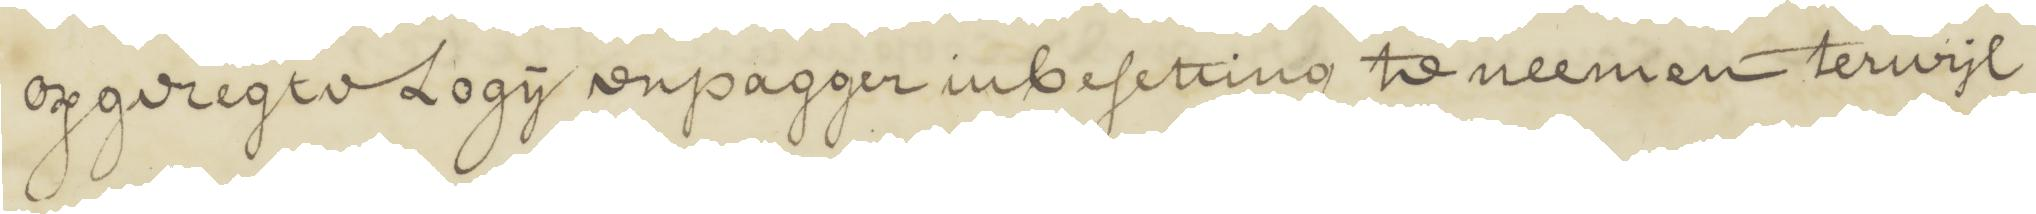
opgeregte Logij en pagger inbesetting te neemen terwijl
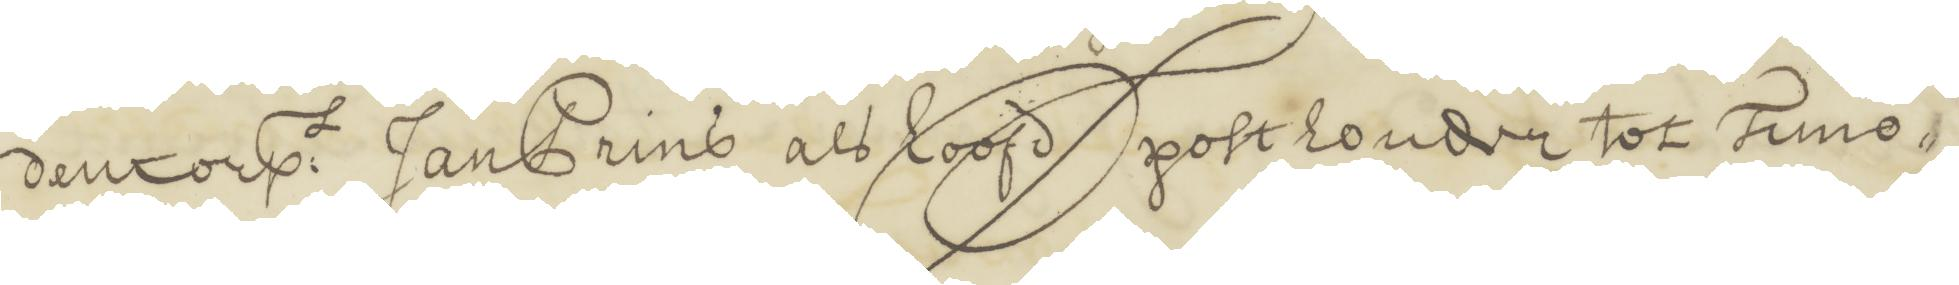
den corp:l Jan Prins als hoofd post houder tot Timo„
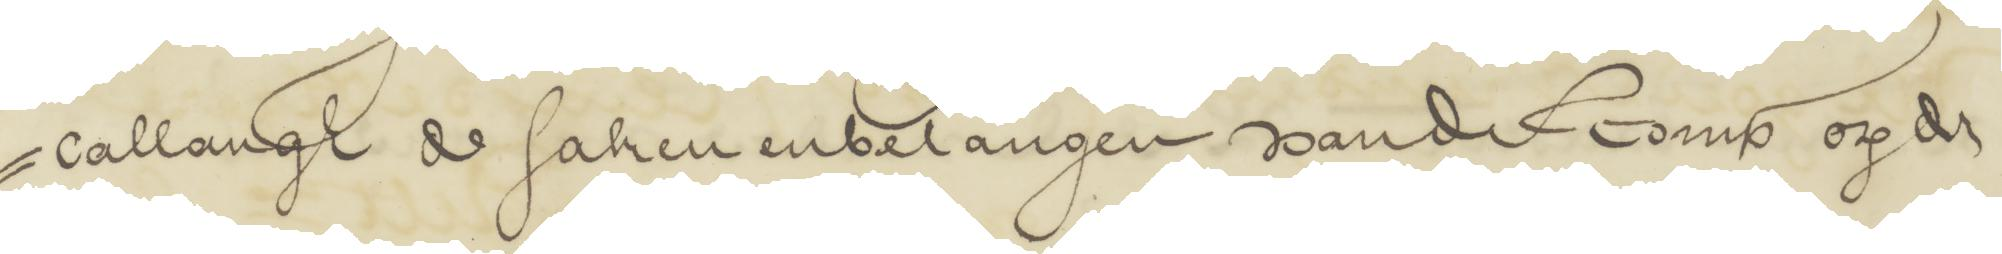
=callangh de saken en belangen van d E Comp op den
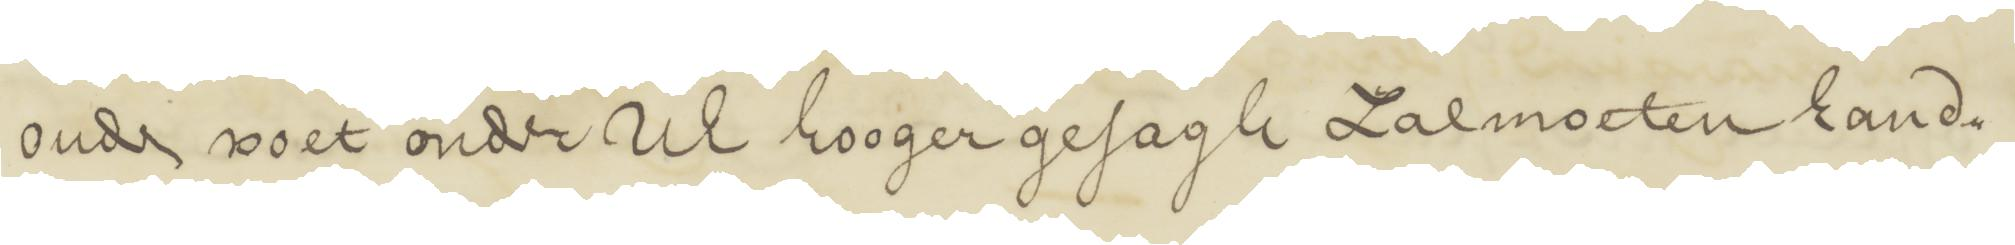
ouden voet onder UE hooger gesagh zal moeten hand„
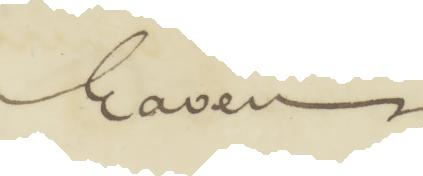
haven
